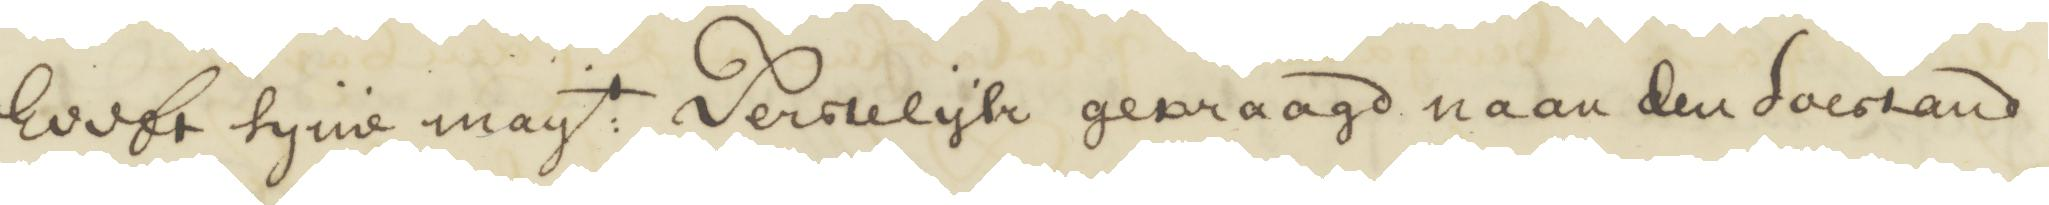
heeft sijne maij:t Eerstelijk gevraagd naar den toestand
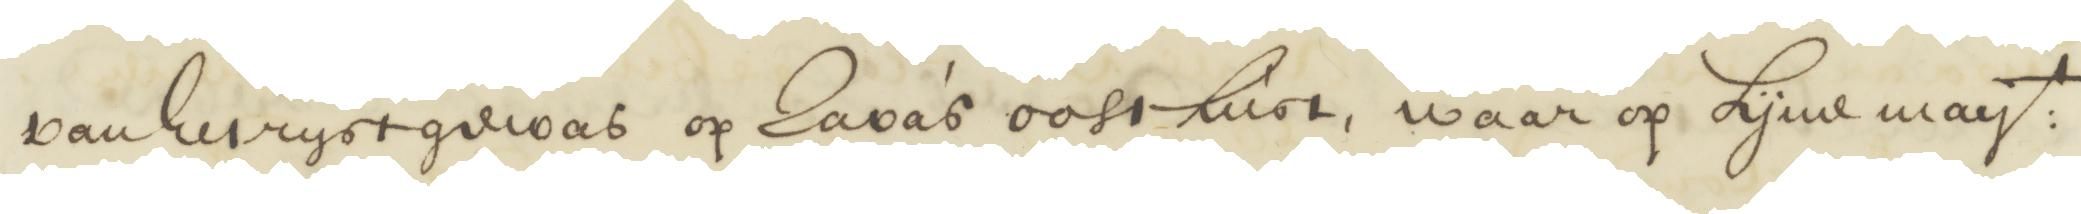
van het rijstgewas op Iavas oost kust, waar op sijne maij:t
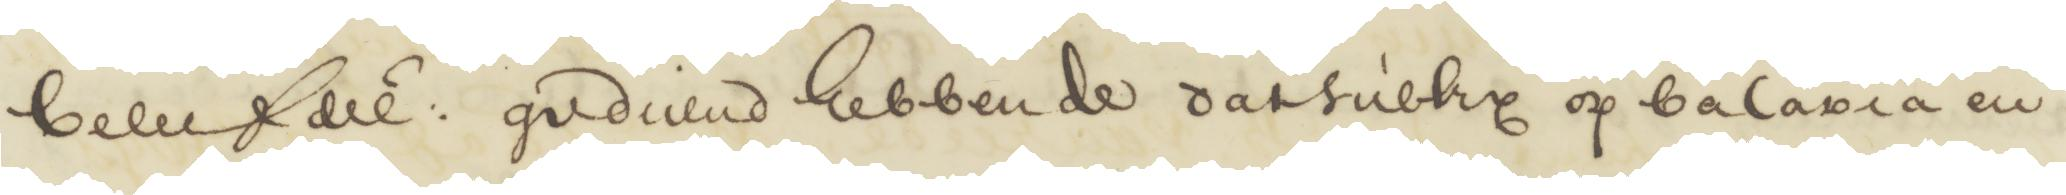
beleefdel: gediend hebbende dat sulkx op batavia en
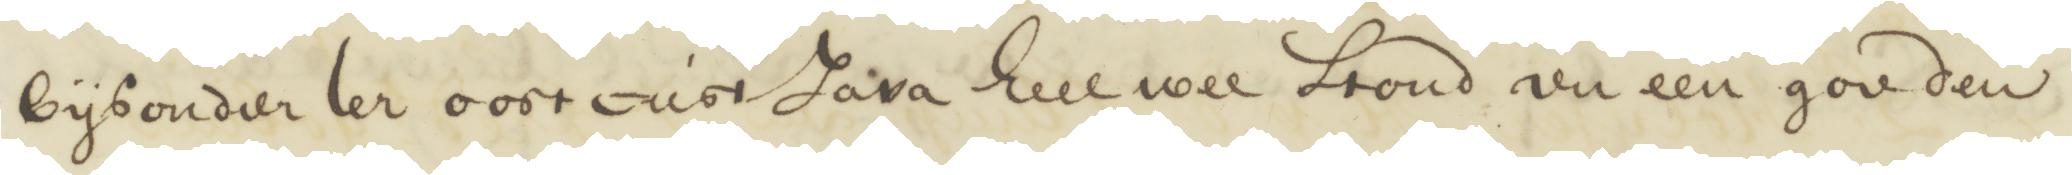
bijsonder ter oost cust Iava heel wel stond en een goeden
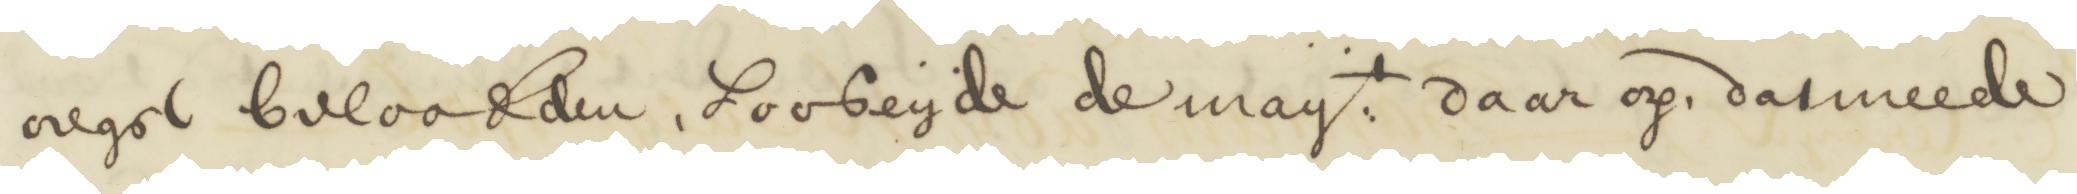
oegst beloofden, soo seijde de maij:t daar op, dat meede
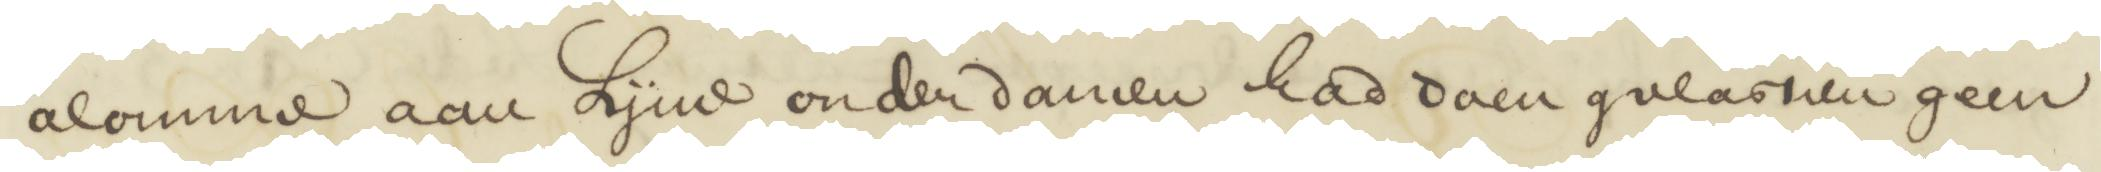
alomme aan sijne onder danen had doen gelasten geen
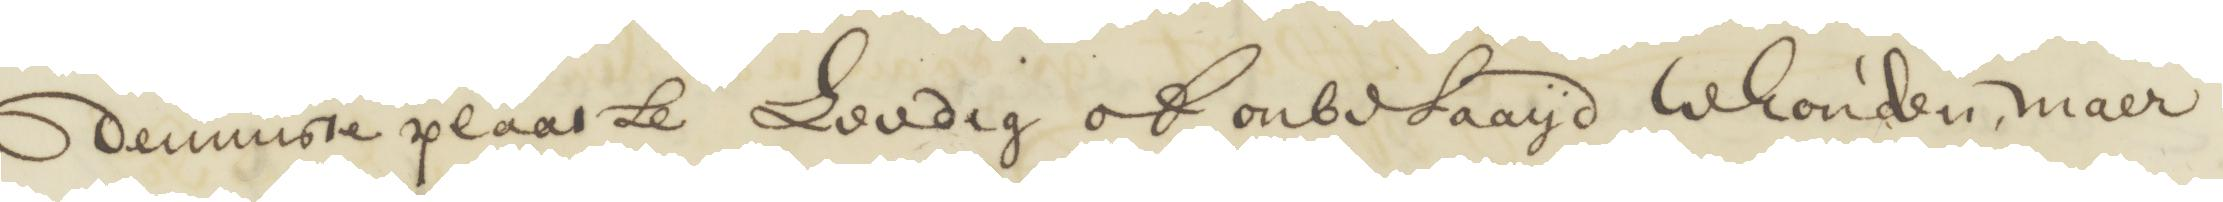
de minste plaatse Leedig of onbesaaijd tehouden, maer
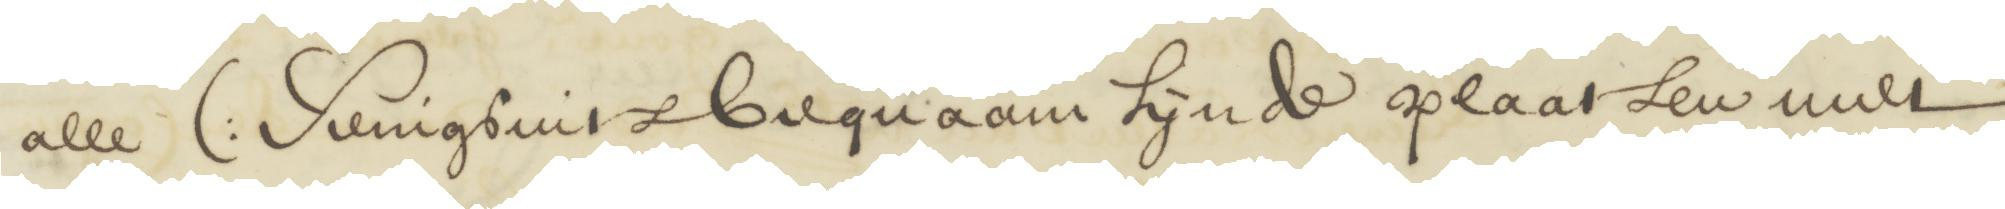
alle (:Eenigsintz bequaam sijn de plaatsen met
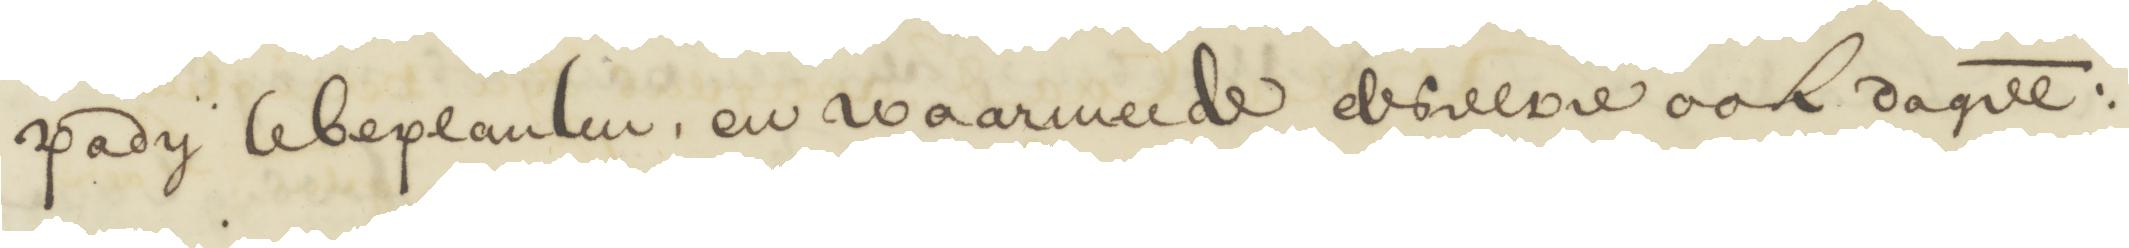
padij tebeplanten, en waarmeede deselve ook dagel:
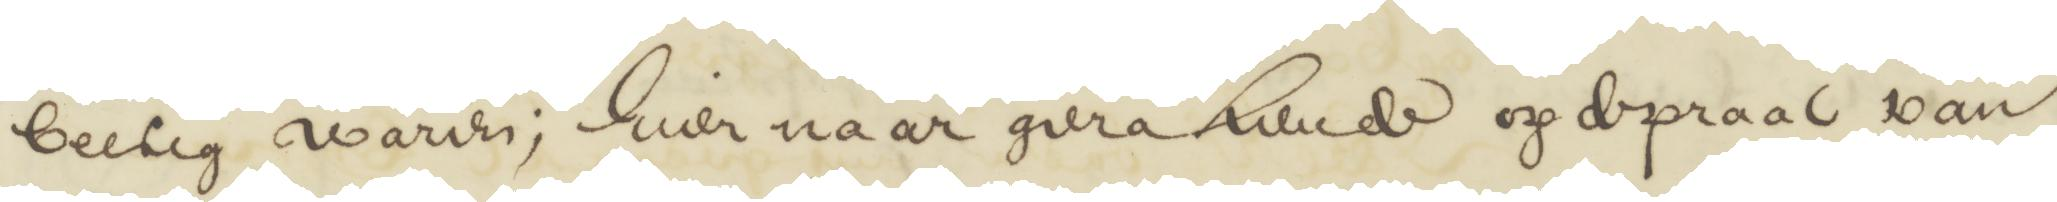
beesig waren; hier naar gerakende op de praat van
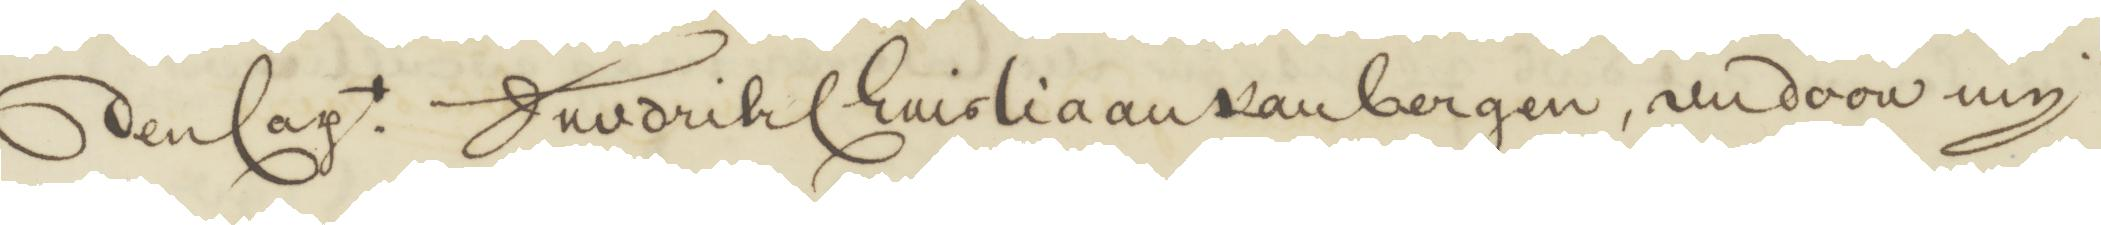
den Cap.t Fredrik Christiaan van bergen, en door mij
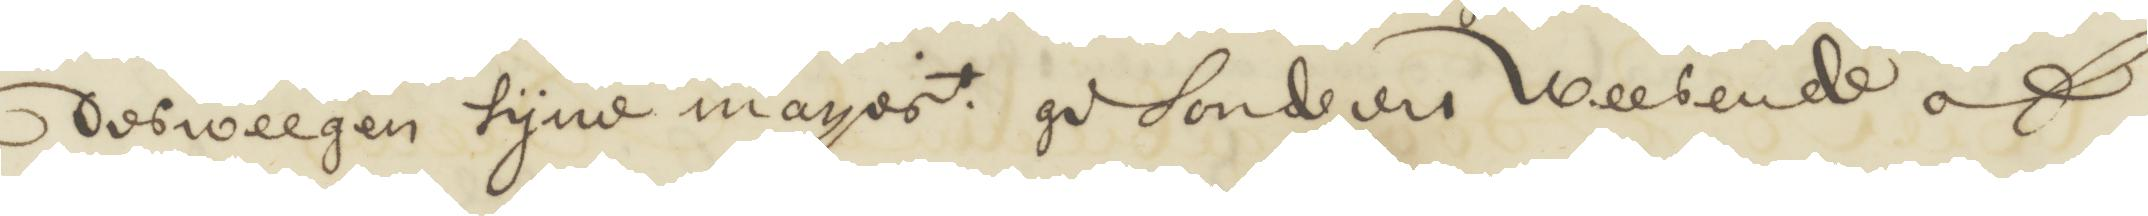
desweegen sijne maijes.t gesondeert weesende of
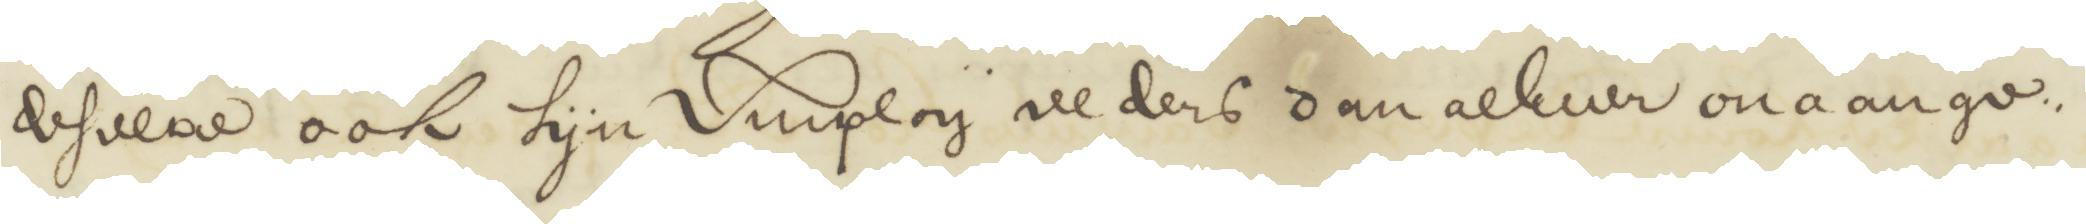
deselve ook sijn Emploij elders dan alhier onaange„
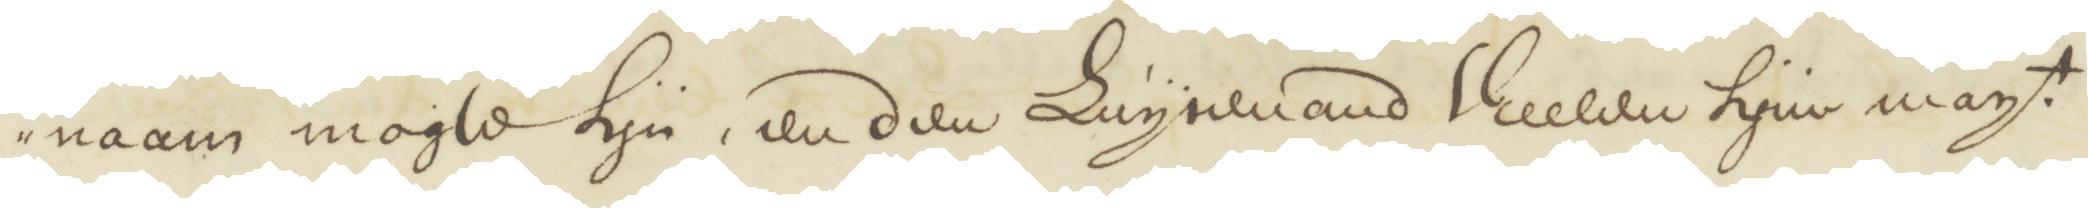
„naam mogte sijn, en dien Luijtenand theelen sijne maij.t
